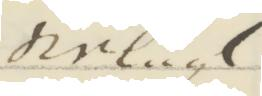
V vlugt
